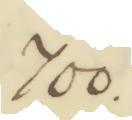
700.
